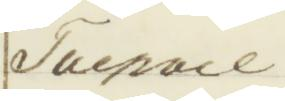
Toepoel
